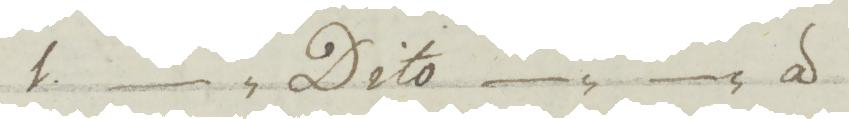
1: —„ Dito —„ —„ a
